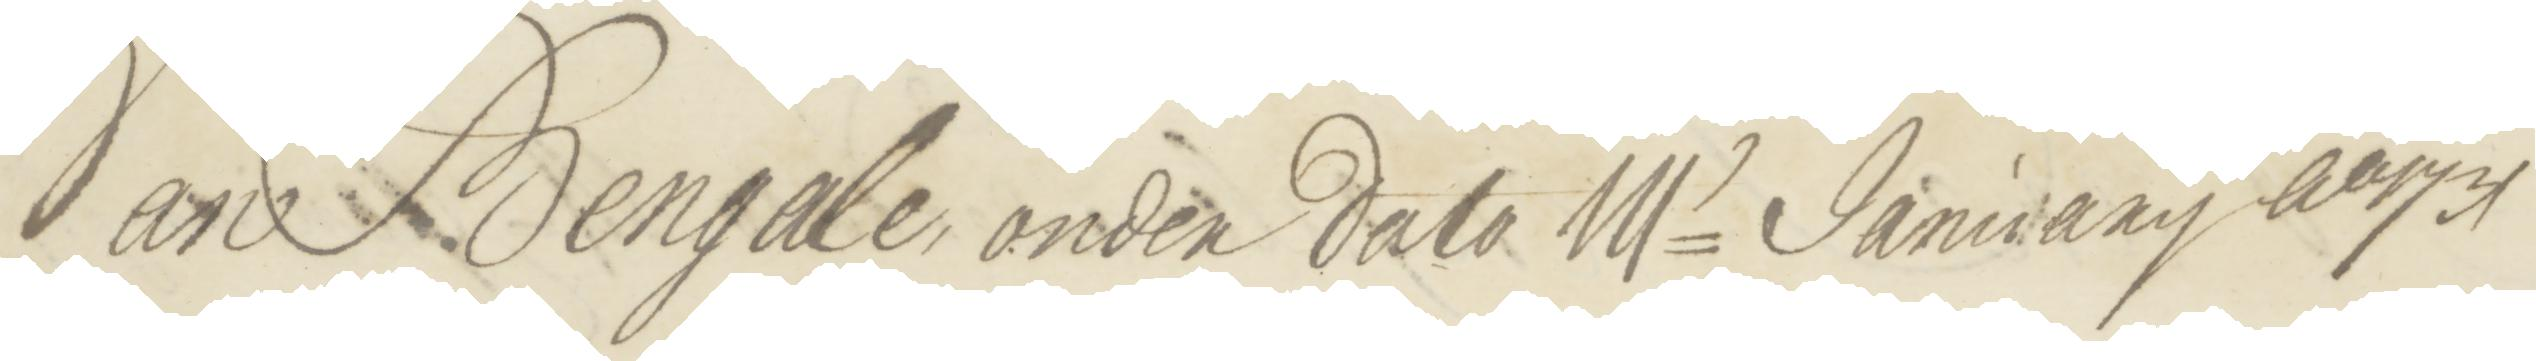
Van Bengale, onder dato 14=' January Ao 1731
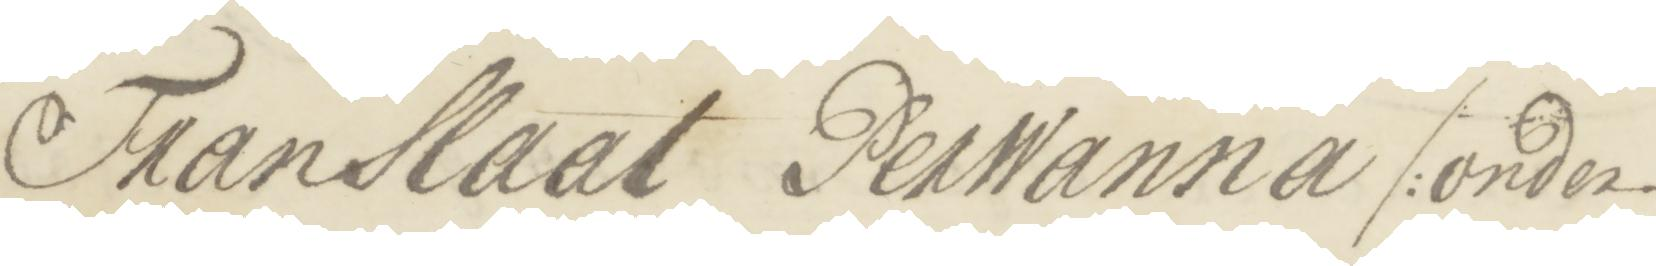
Translaat Perwanna /:onder
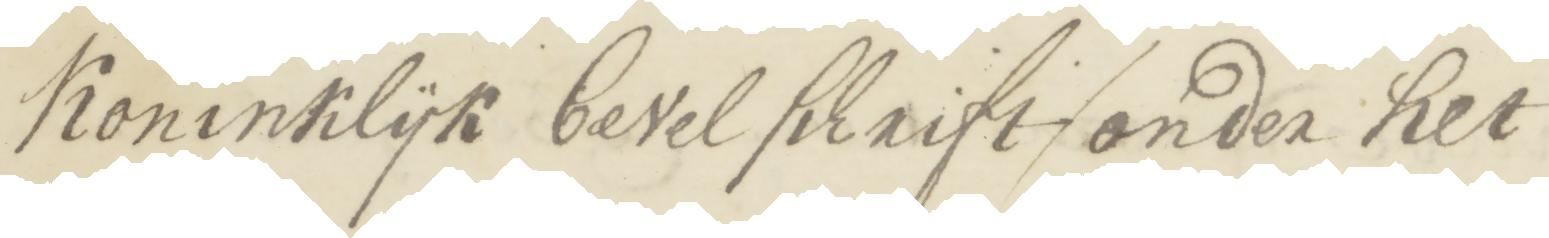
Koninklijk bevel schrift /onder het
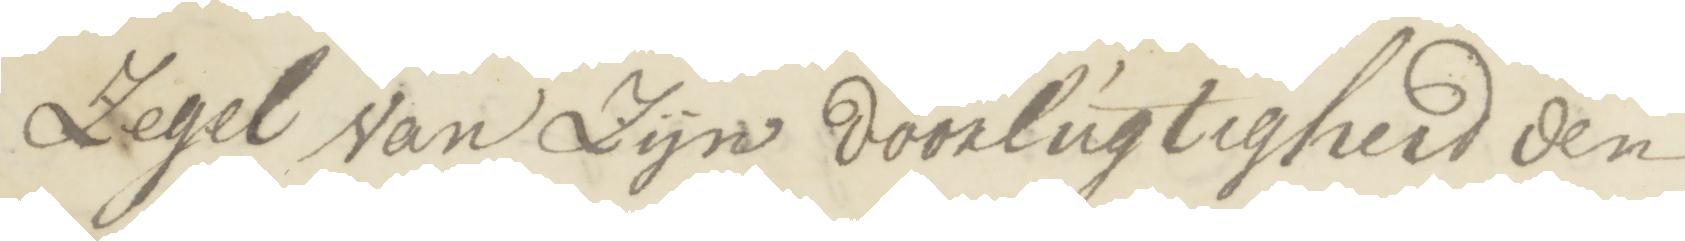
Zegel van zijn doorlugtigheid den
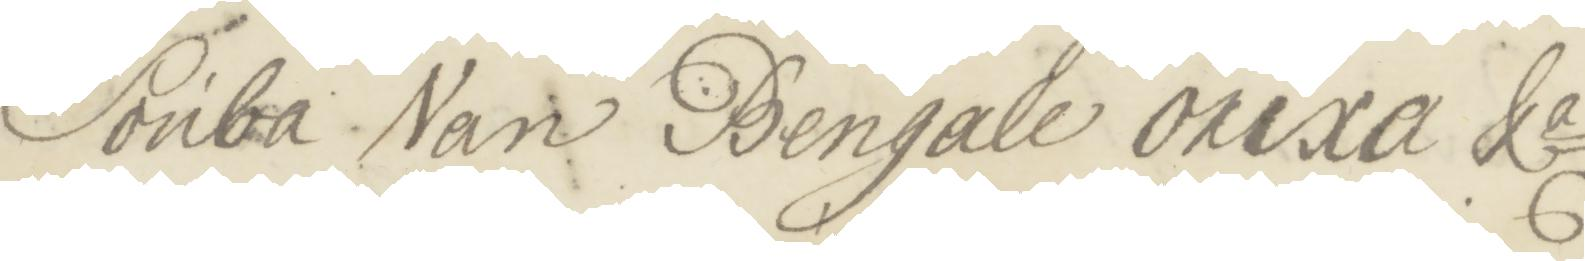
Souba Van Bengale orixa &=a
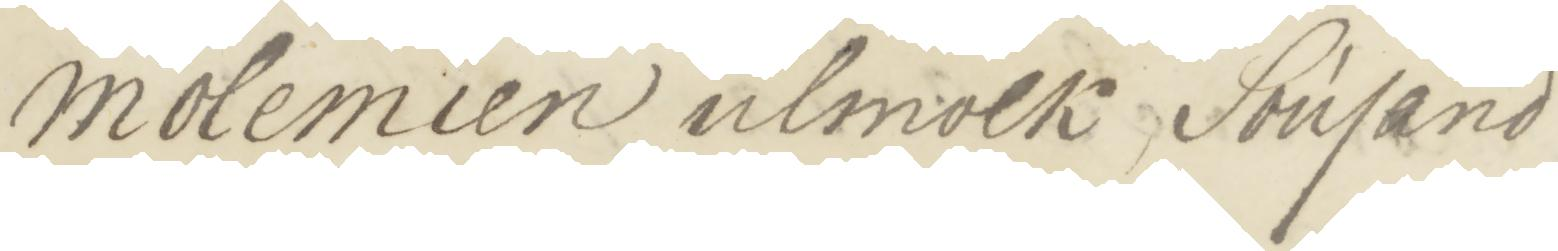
molemien ulmolk, Soujand
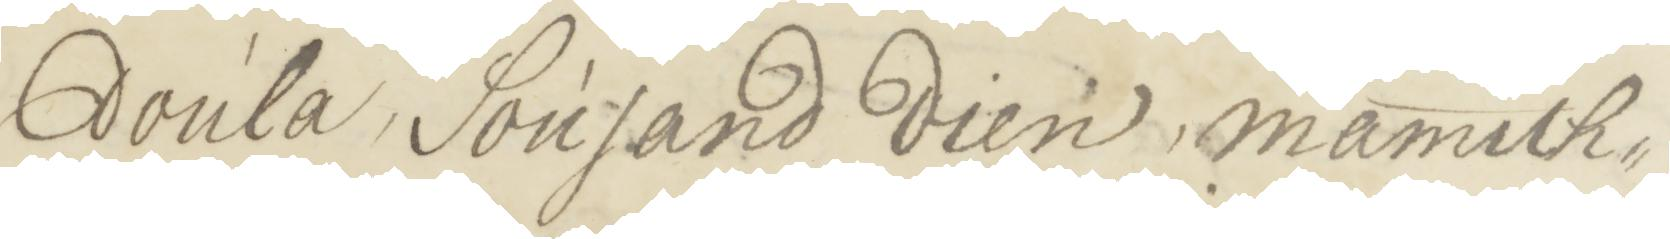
doula, Soujand dien, mamith„
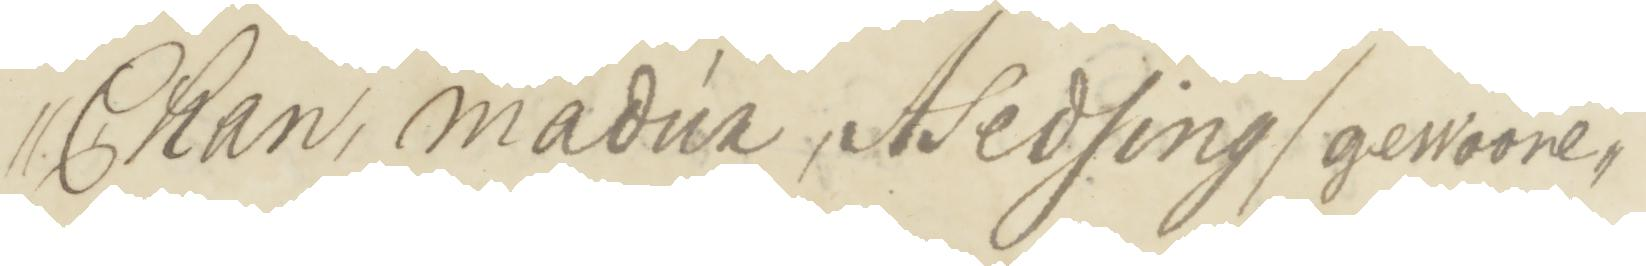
„Chan, madur, Asedjing /gewoone„
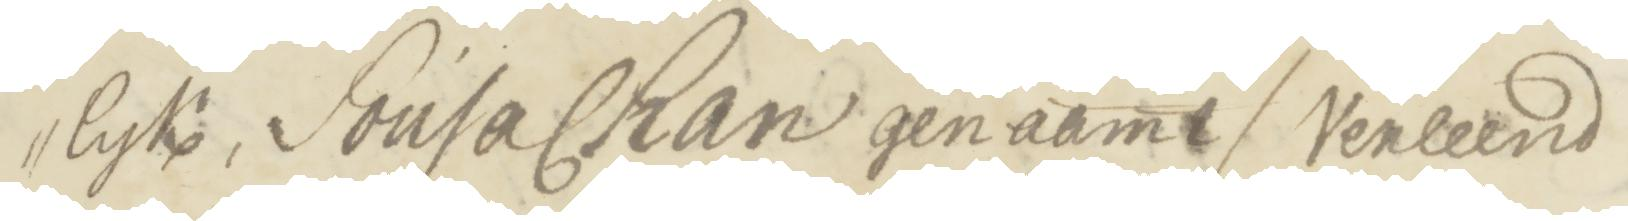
„lijk, Sousa Chan genaamt / Verleend
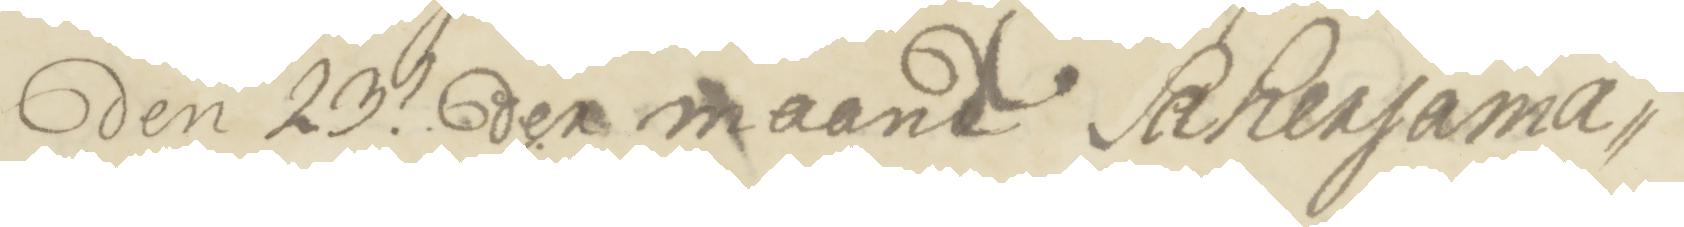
den 23.' der maand Saherjama„
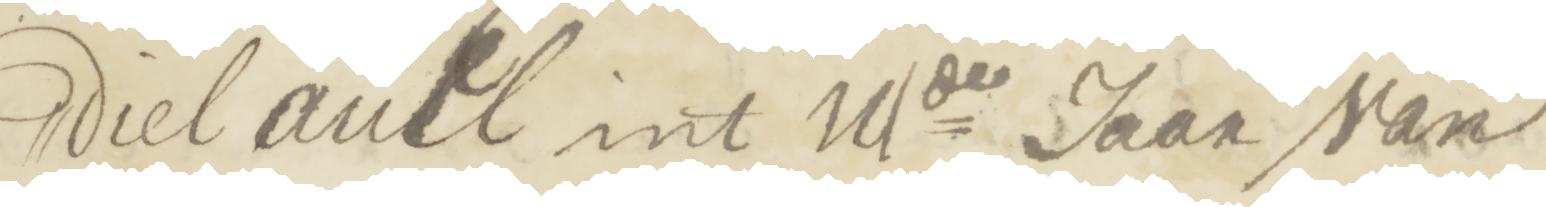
„diel aull int 14=de Jaar van
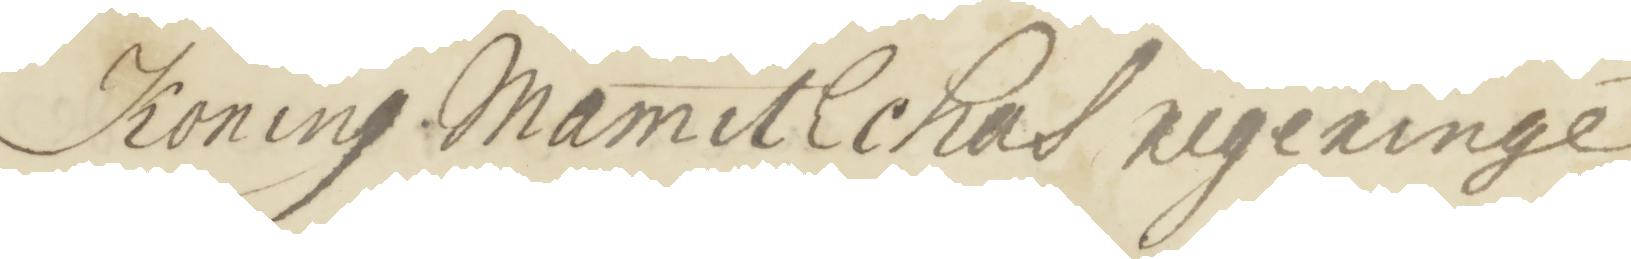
Koning Mamithchas regeringe
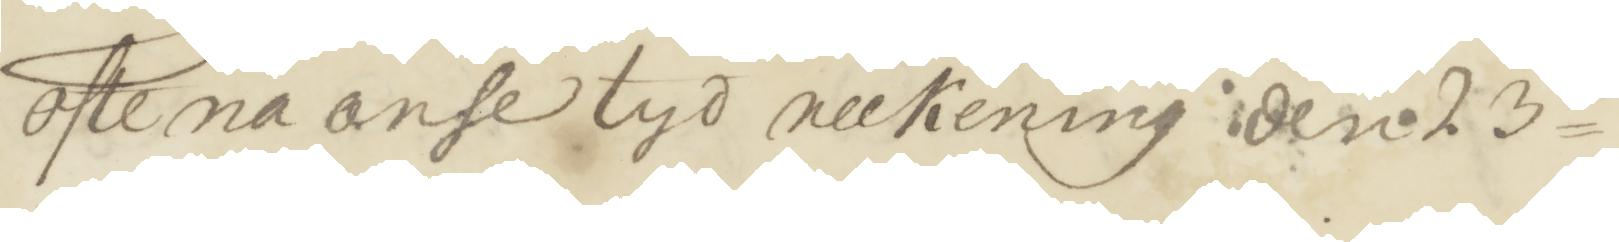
ofte na onse tyd reekening den 23='
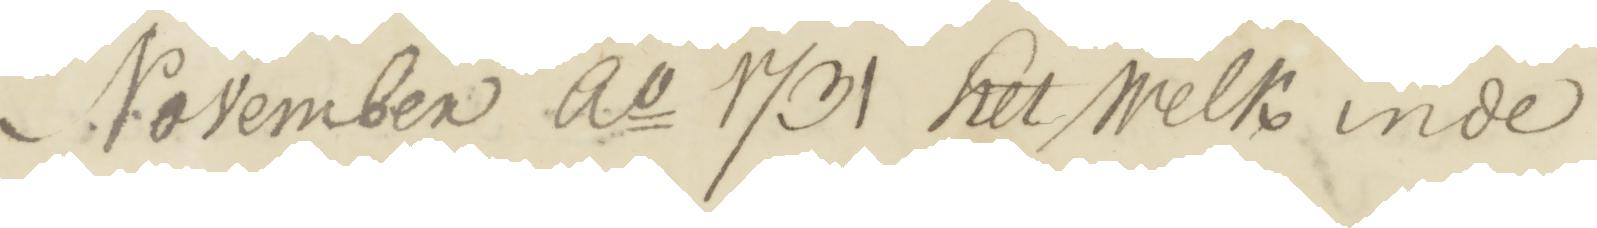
November A=o 1731 het welk inde
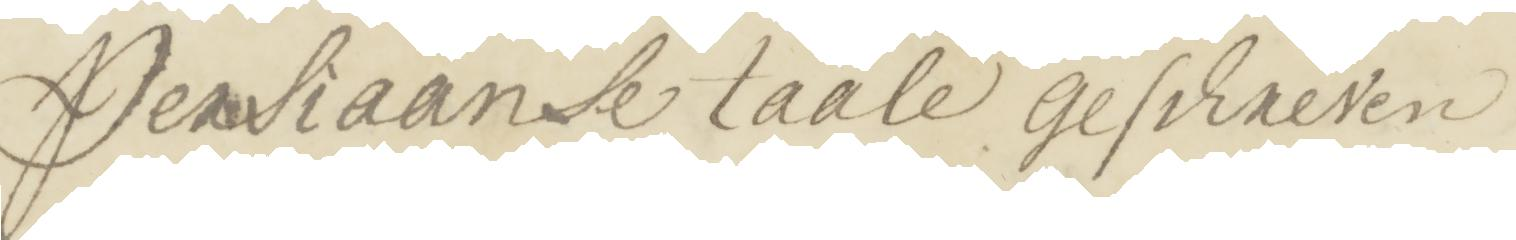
Persiaanse taale geschreven
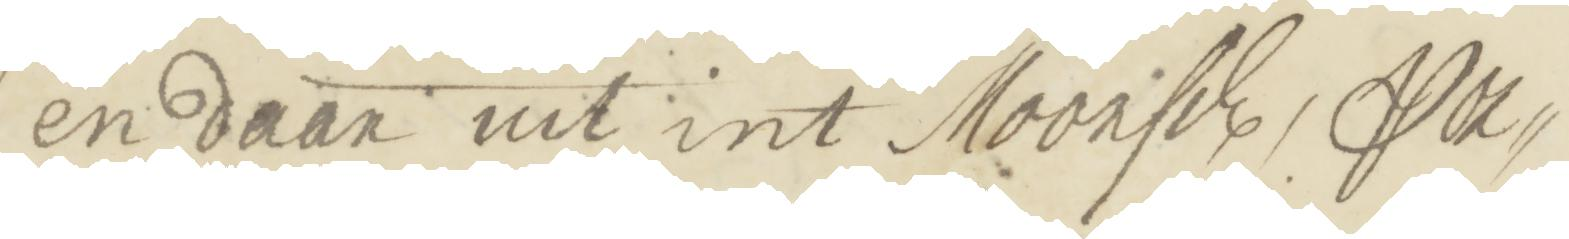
en daar uit int Moorsch, Por„
